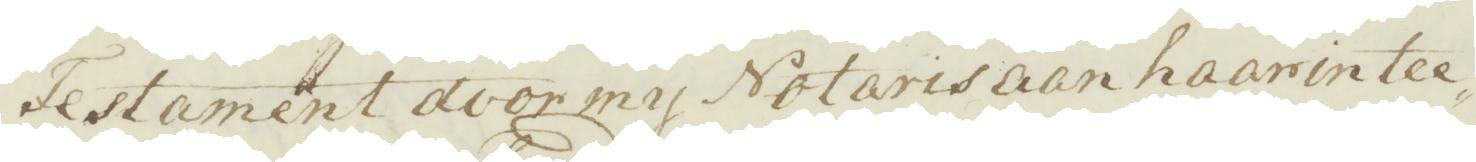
Testament door mij Notaris aan haar in tee„
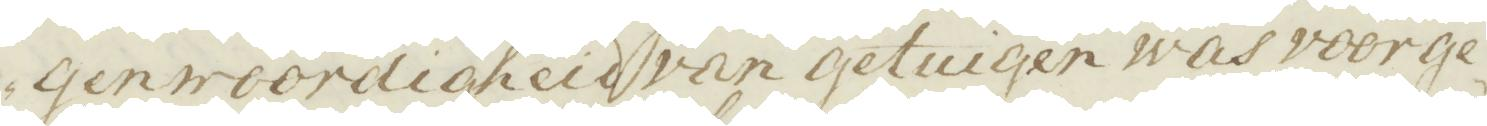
„genwoordigheid van getuigen was voorge„
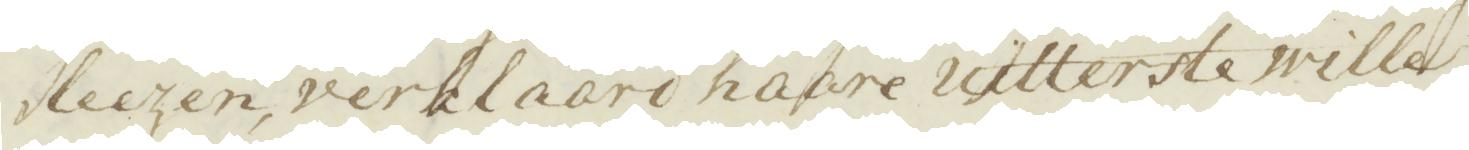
leezen, verklaard haare uitterste wille
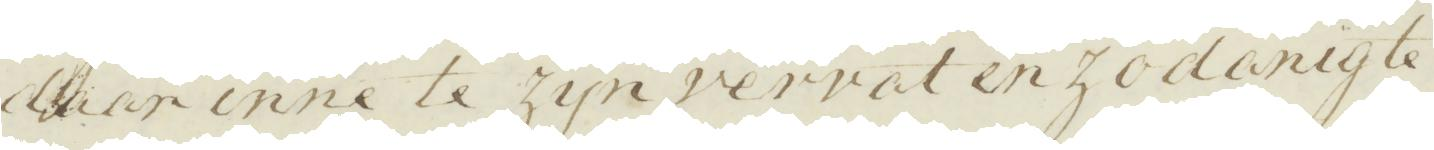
daar inne te zijn vervat en zodanig te
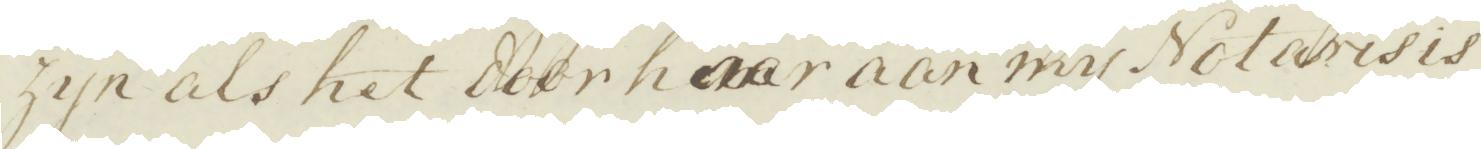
zyn als het door haar aan my Notaris is
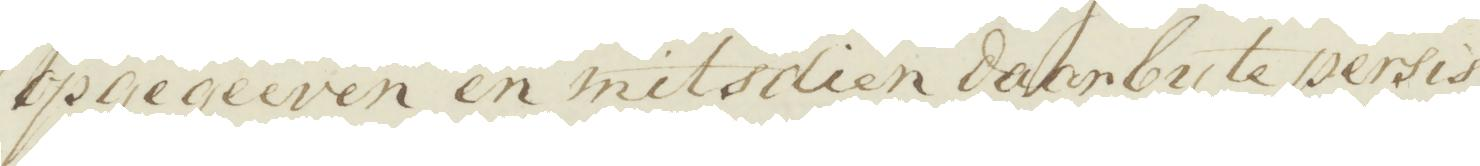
opgegeeven en mitsdien daar by te persis
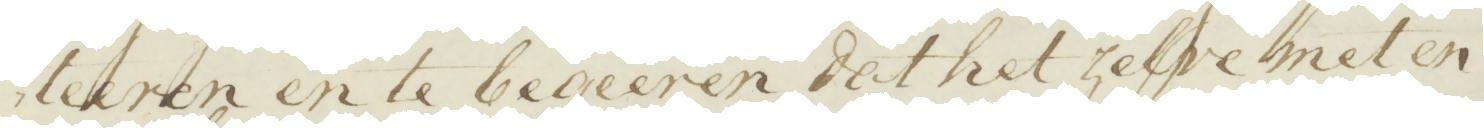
„teeren en te begeeren dat het zelve met en
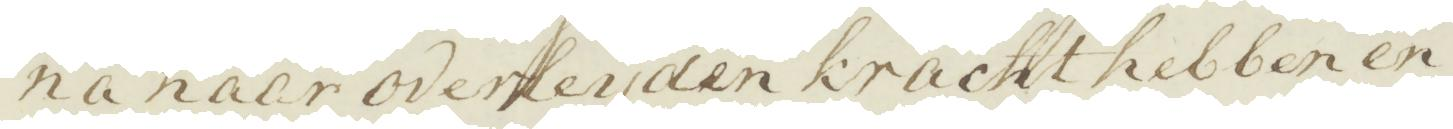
na haar overleyden kracht hebben en
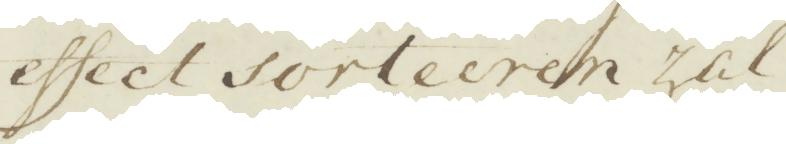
effect sorteeren zal
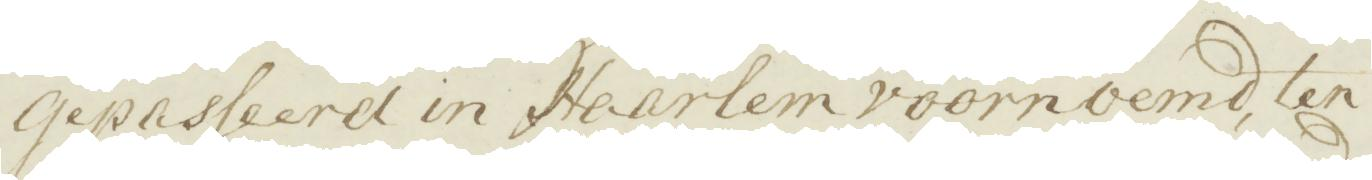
gepasseerd in Haarlem voornoemd, ten
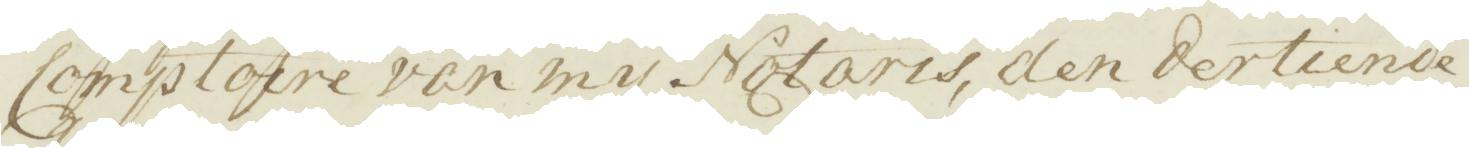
Comptoire van my Notaris, den dertiende
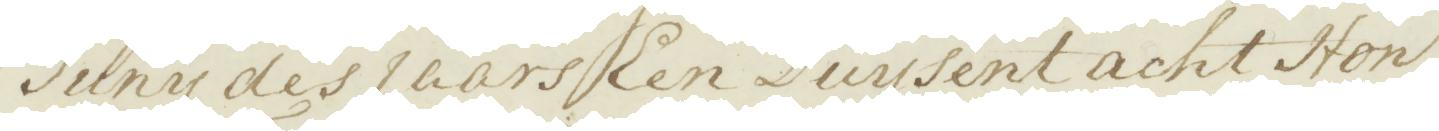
Juny des Jaars Een Duijsent acht Hon
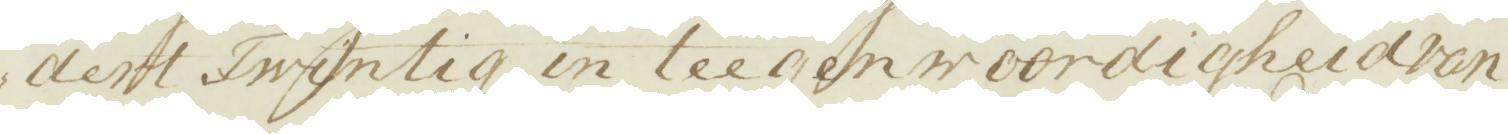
„dert Twintig, in teegenwoordigheid van
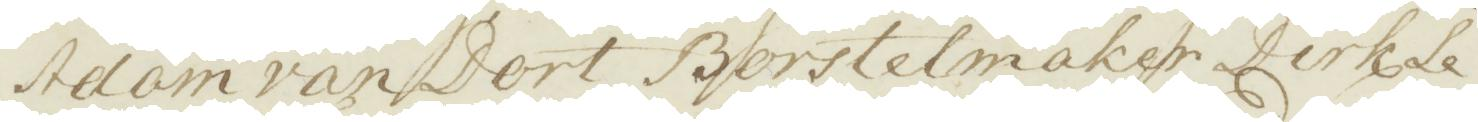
Adam van Dort Borstelmaker Dirk Le
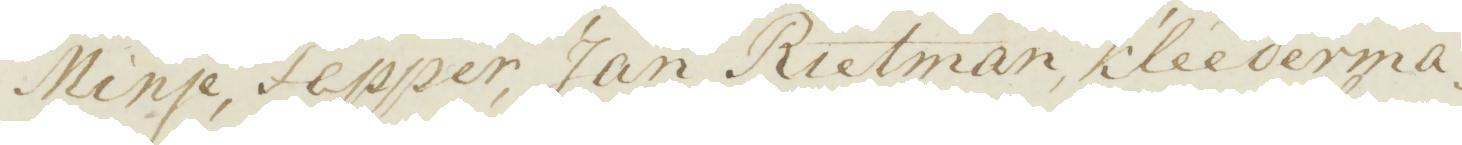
Minje, Tapper, Jan Rietman, Kleederma„
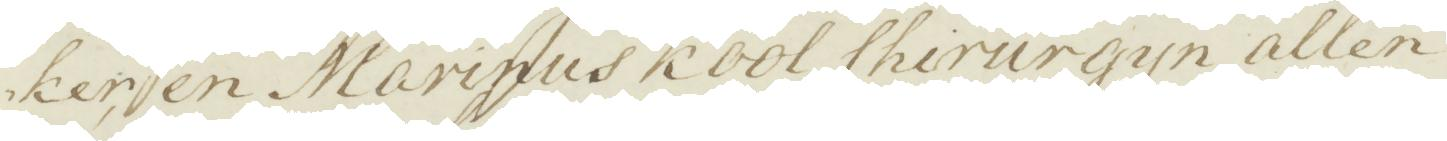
„ker, en Marinus Kool Chirurgijn allen
